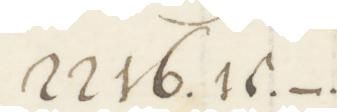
2216.15.-.
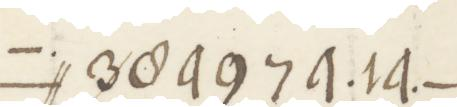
-.„ 384974.14.-.-
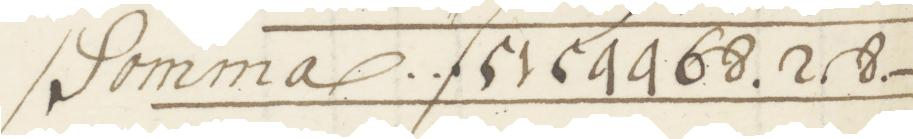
Somma . . ƒ5154468.2.8.-
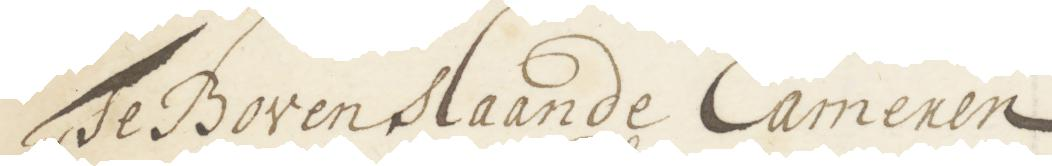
Te Bovenstaande Cameren
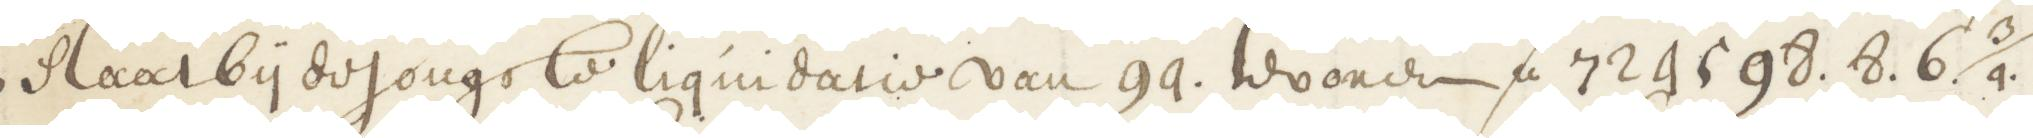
staat bij dejongste liquidatie van 94. tevoren ƒ724598.8.8.6¾
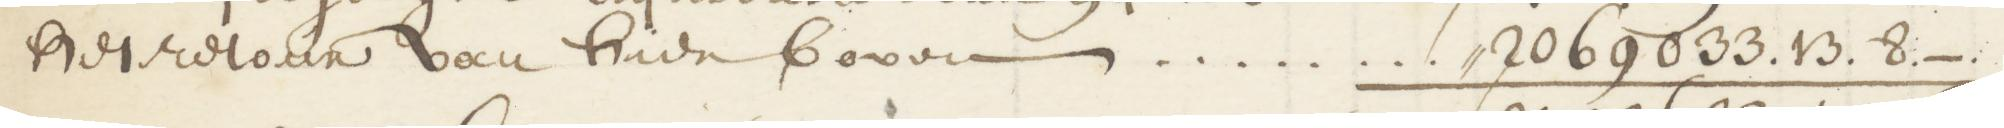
het retour van hier boven . . . . . . . . „2069033.13.8. -.
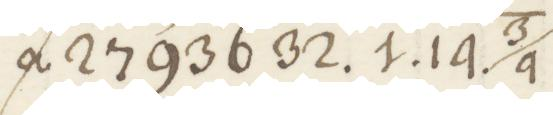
ƒ2793632.1.14.¾
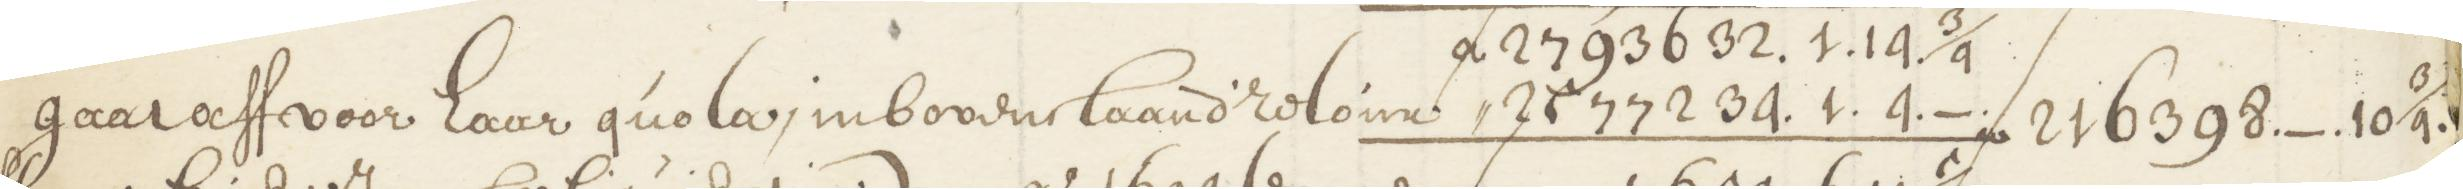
gaat aff voor haar quota, inboventaand retour „ 2577234.1.4. ƒ 216398.-.10¾.
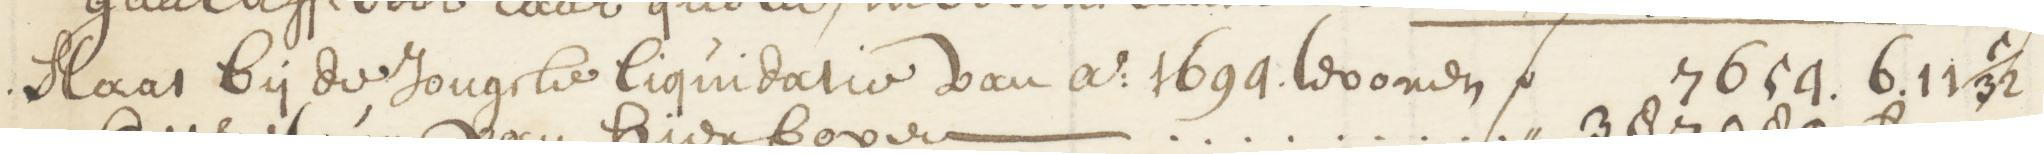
Slaat bij de jongste liquidatie van a:o 1694 tevoren ƒ 7654.6.11 5/32
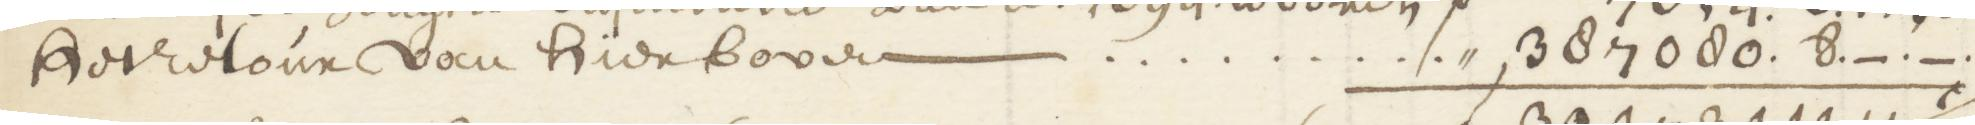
Het retour van hier boven . . . . . . . . . . „ 387080. 8.-.-.
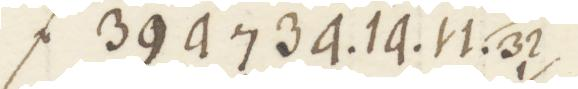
ƒ 394734.14.11 5/32
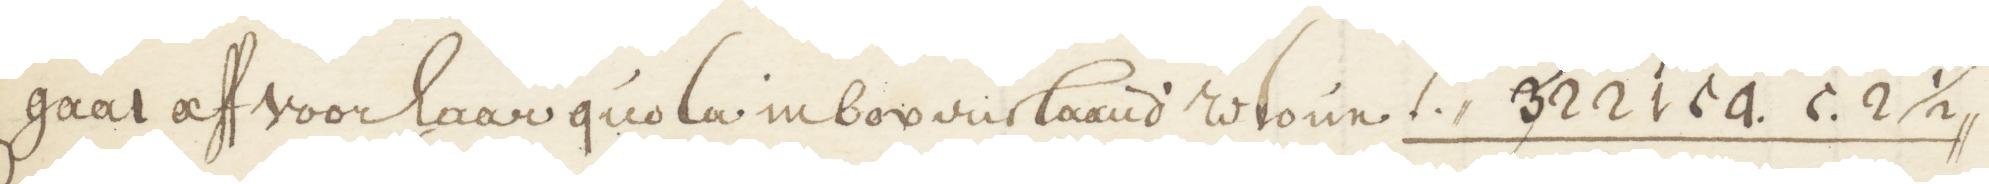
gaat aff voor haar quota in bovenstaand' retour 322154.5.2½„
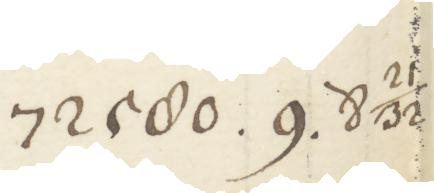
72580.9.8 21/32
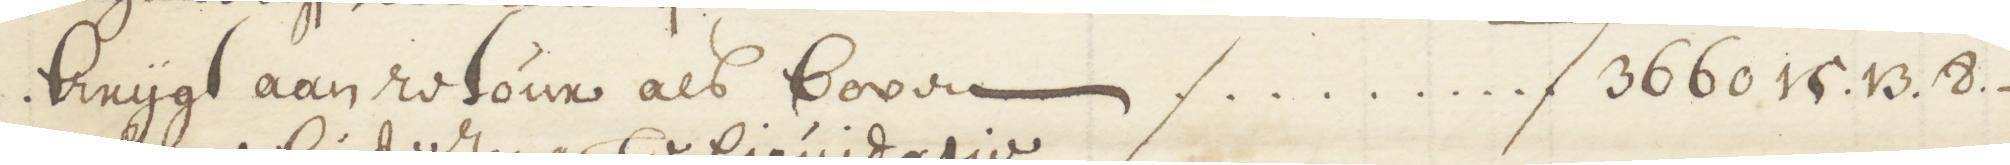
krijgt aan retour als boven / . . . . . . . . . ƒ366015.13.8.-
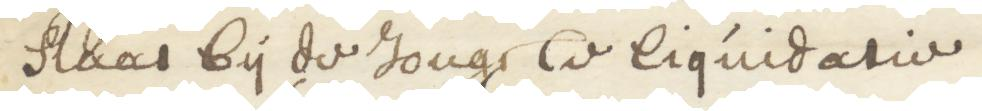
staat bij de jongste liquidatie
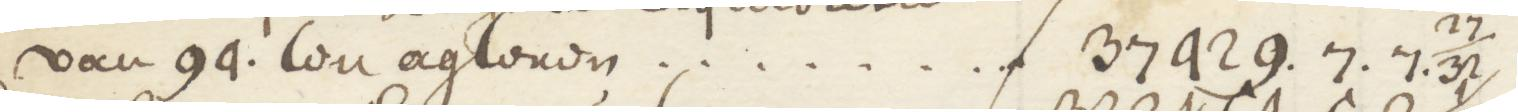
van 94. ten agteren . . . . . . . ƒ 37429.7.7. 27/32
